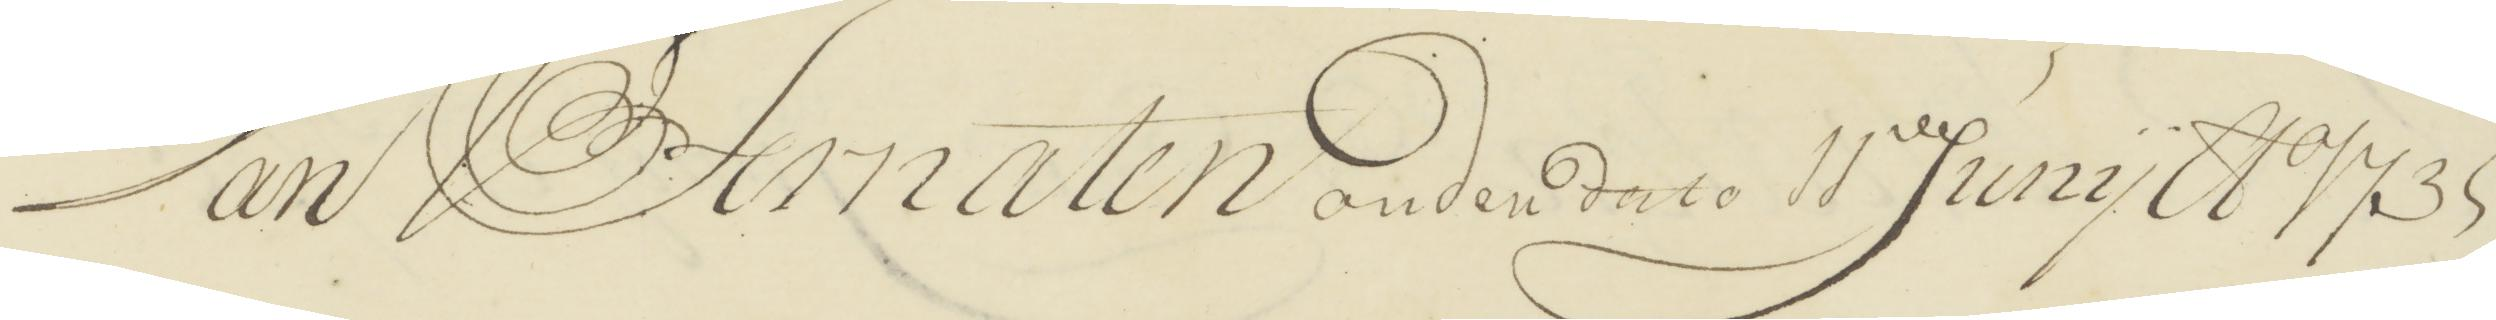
Van Ternaten onder dato 11 Junij Ao 1735
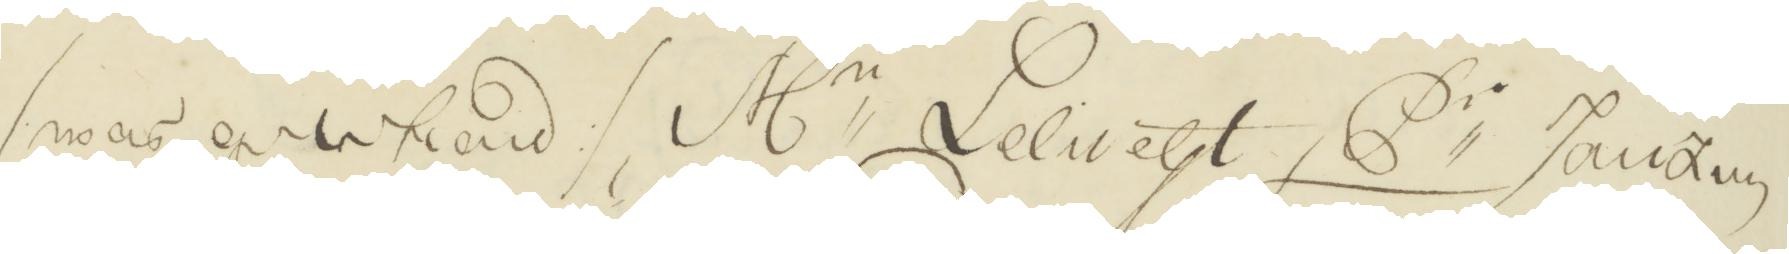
/:was getekend:/ M„r Lelivelt, P„r Janz en
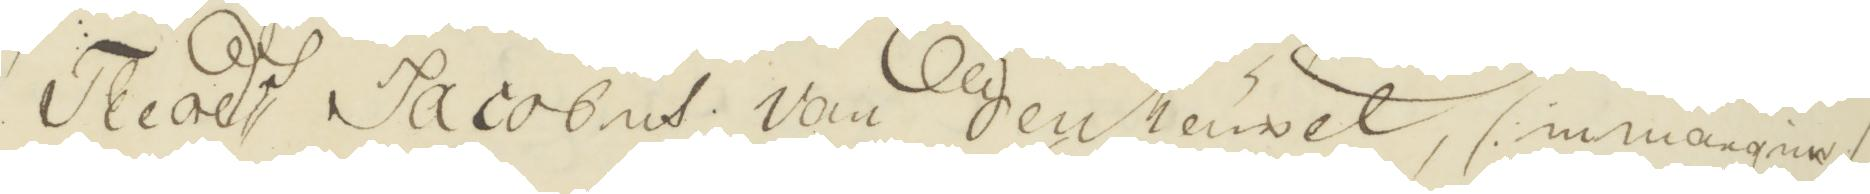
Theod„s Jacobus van den heuvel, /:in margine:/
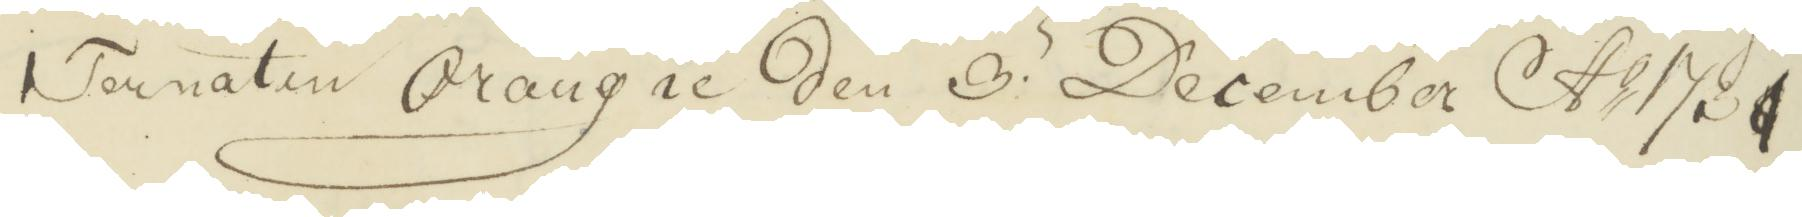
Ternaten Orangie den 3:' December A„o 1734
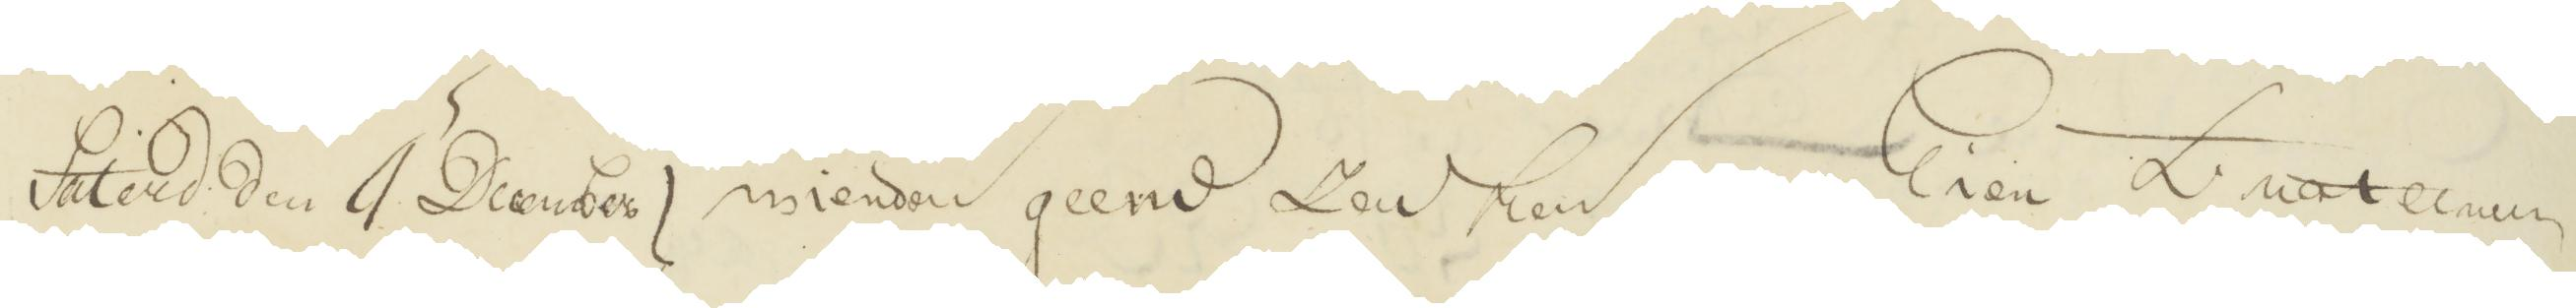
Saterd: den 4:' December wierden geene zaeken om hier te noteeren
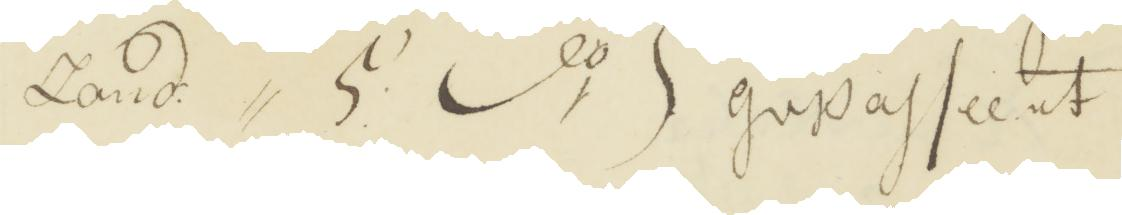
zond. „ 5:' d„o gepasseert
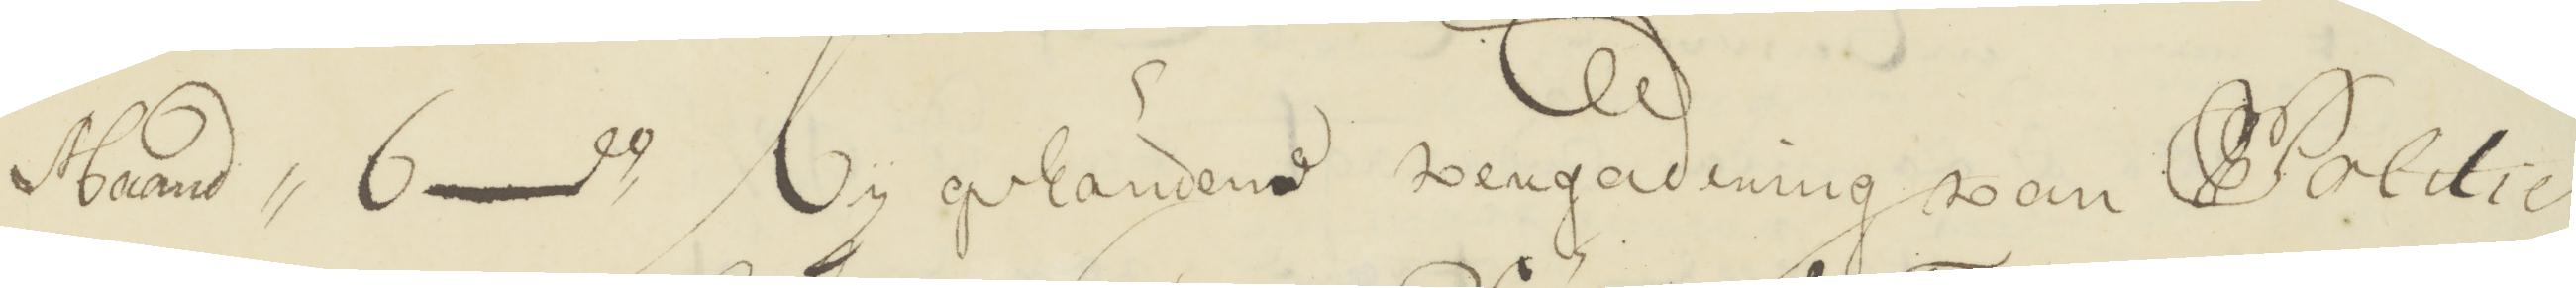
Maand „ 6 _„o bij gehoudene vergadering van Politie
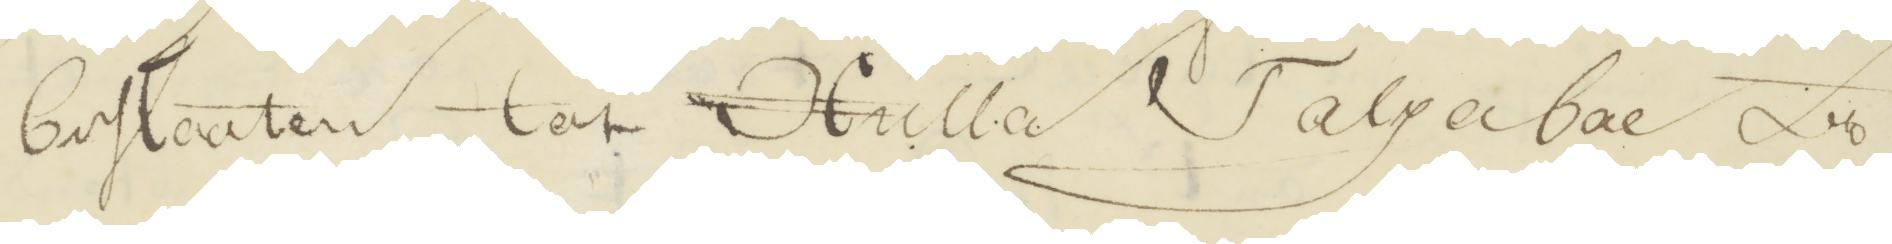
beslooten tot Xulla Talpabae ter
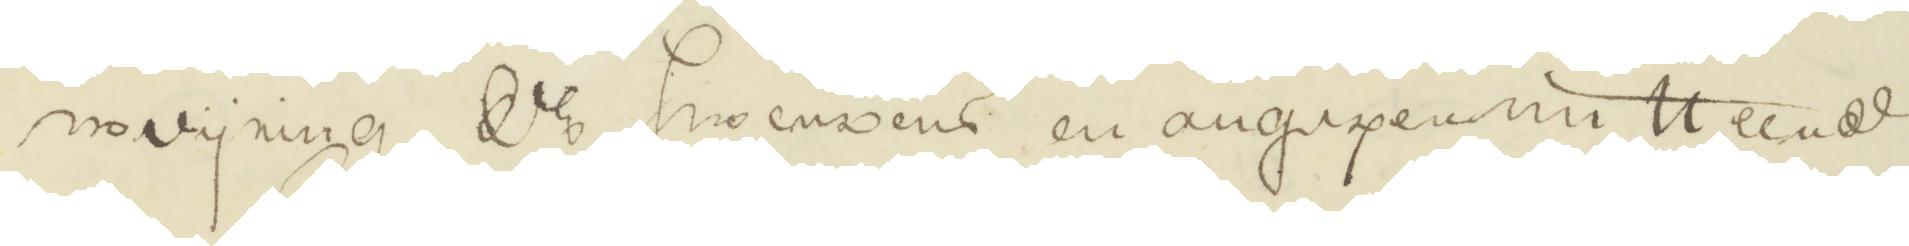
weijring der swervers en ongepermitteerde
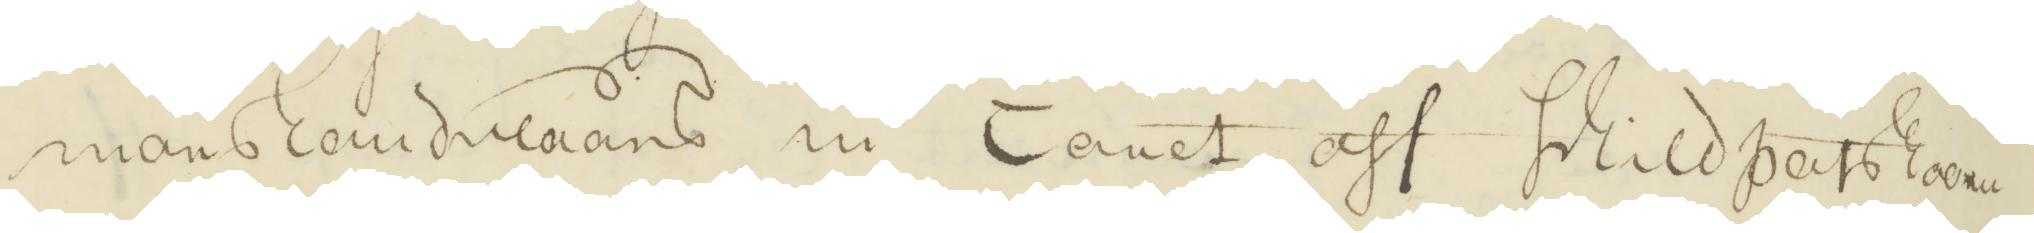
manshandelaars in Caret off schildpatshoorn
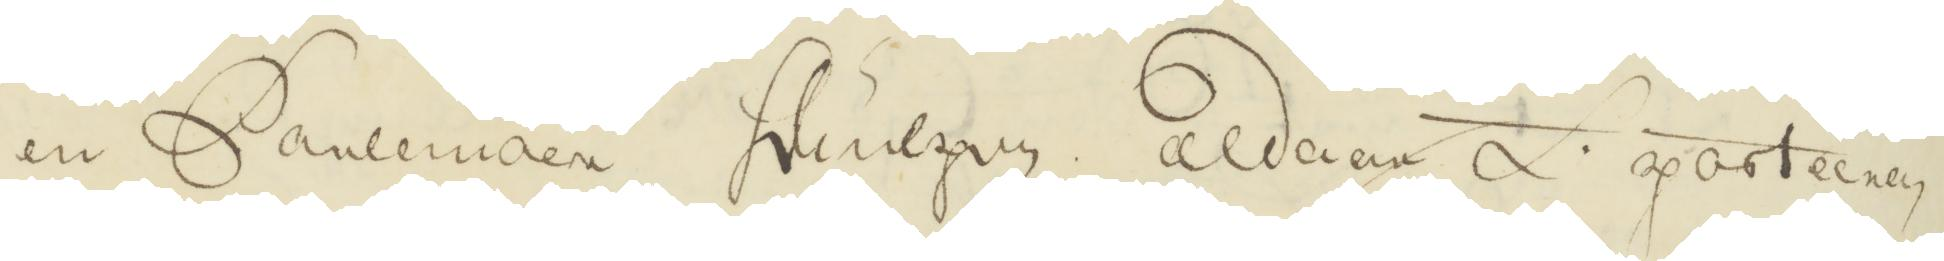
en Parlemoer schulpen aldaar t' posteeren
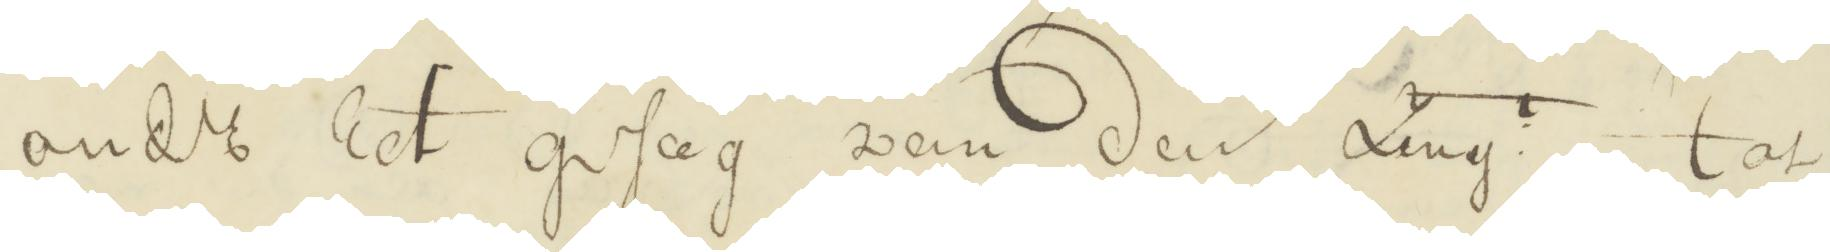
onder het gesag van den zerg:t tot
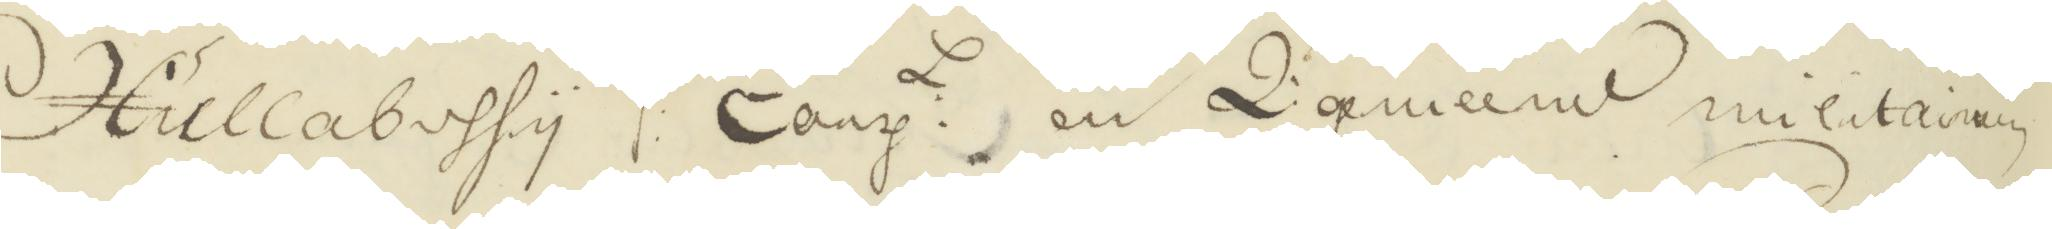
Xullabessij 1: Corp:l en 2:' gmeene militairen
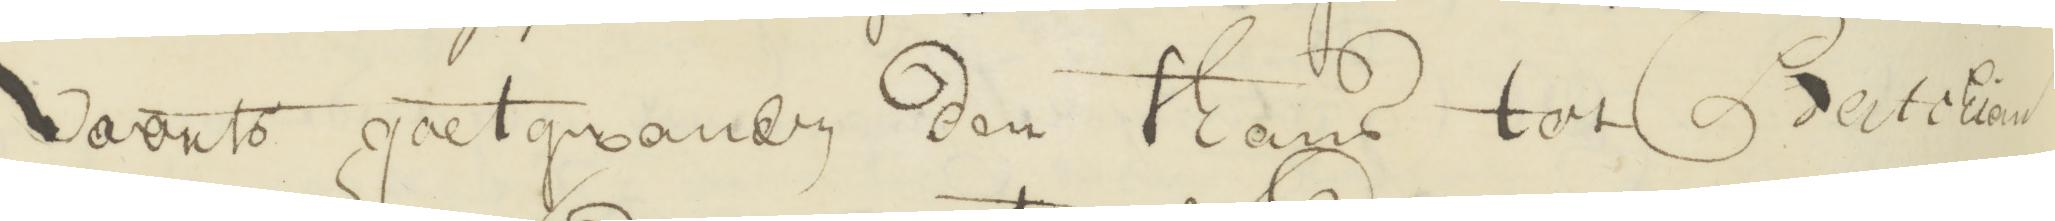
voorts goetgevonden den thans tot Batchian
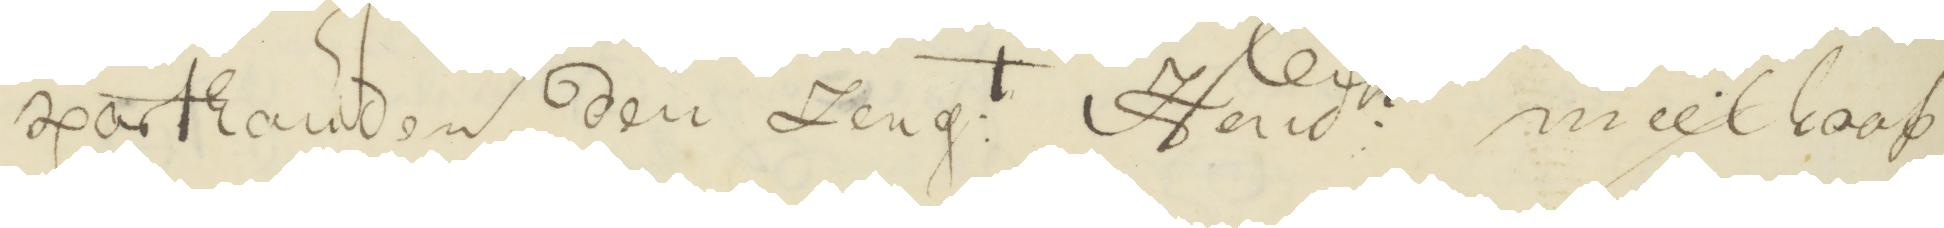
posthouder den zerg:t Hend:k meelkoop
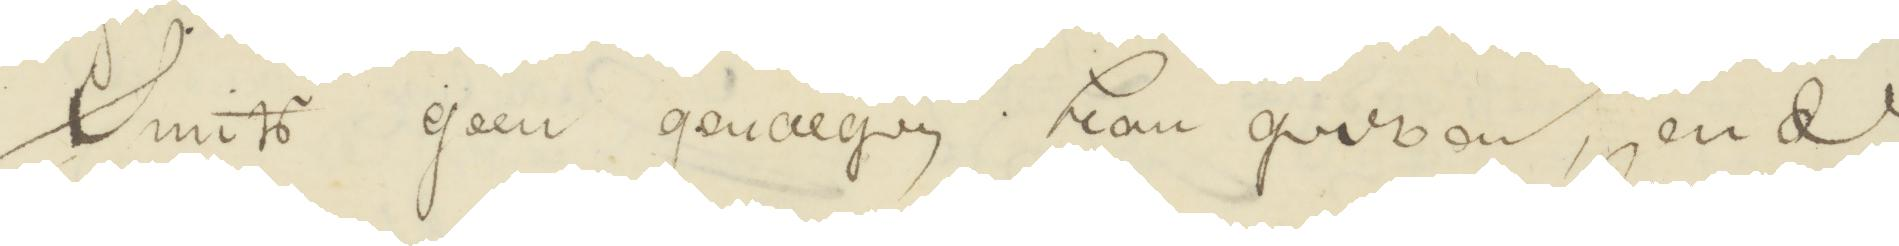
vermits geen genoegen kan geeven, en de
